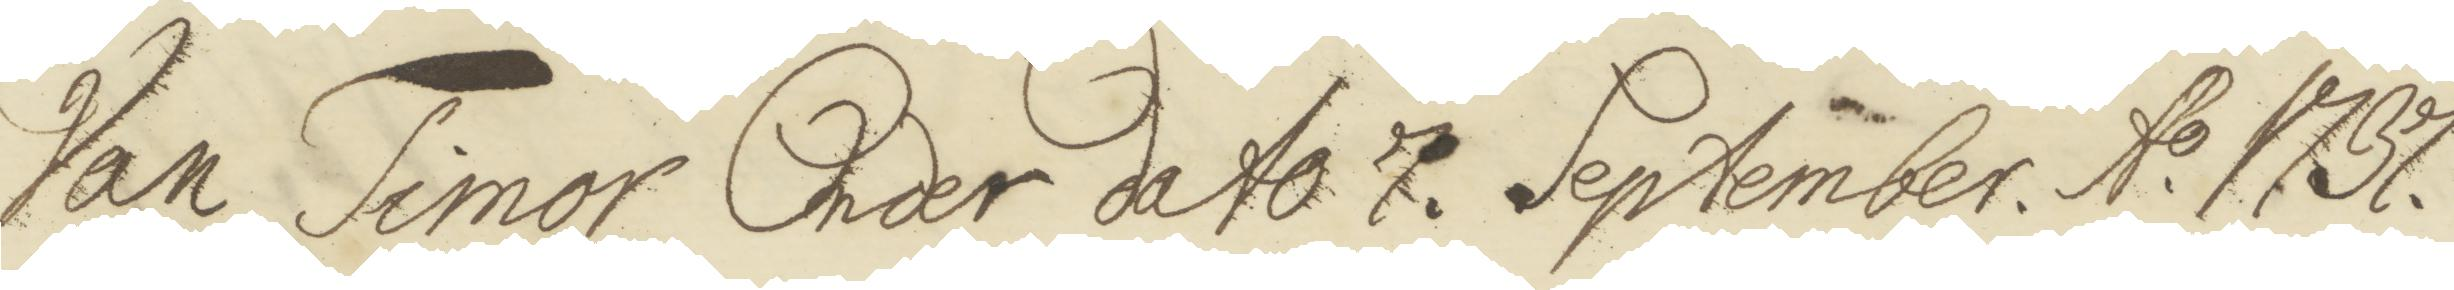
Van Timor Onder dato 7. September A:o 1737.
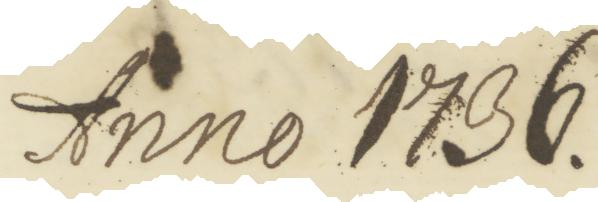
Anno 1736.
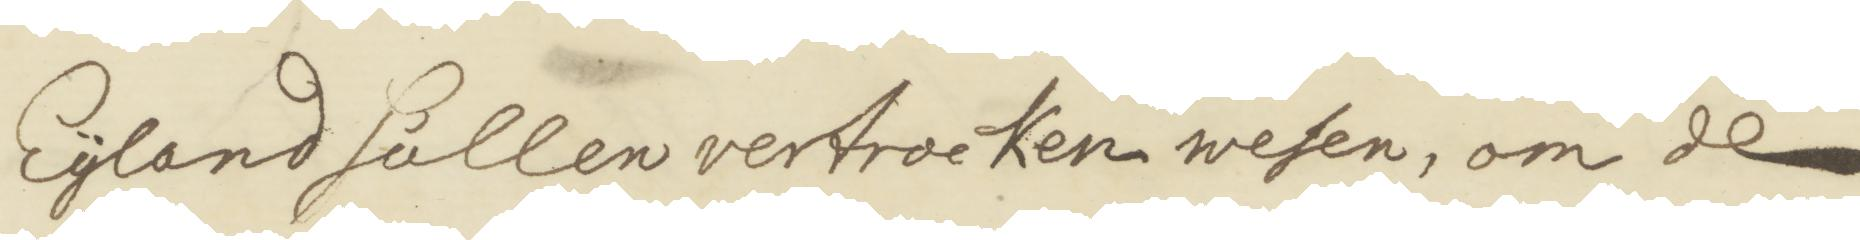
Eijland sullen vertrocken wesen, om de
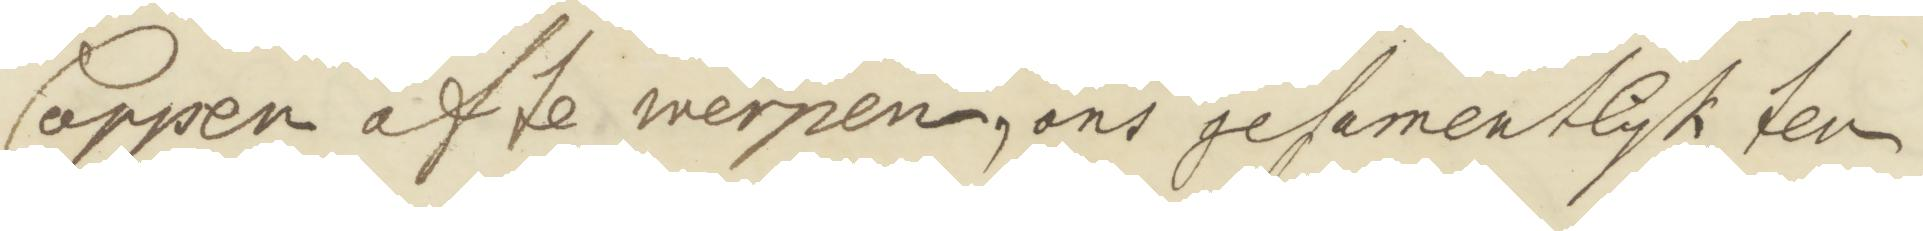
Coppen af te werpen, ons gesamentlijk ten
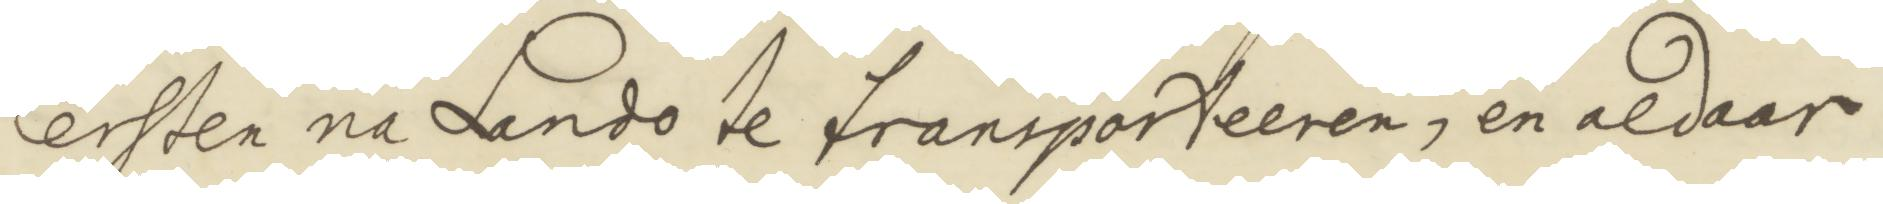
Eersten na Lando te transporteeren, en aldaar
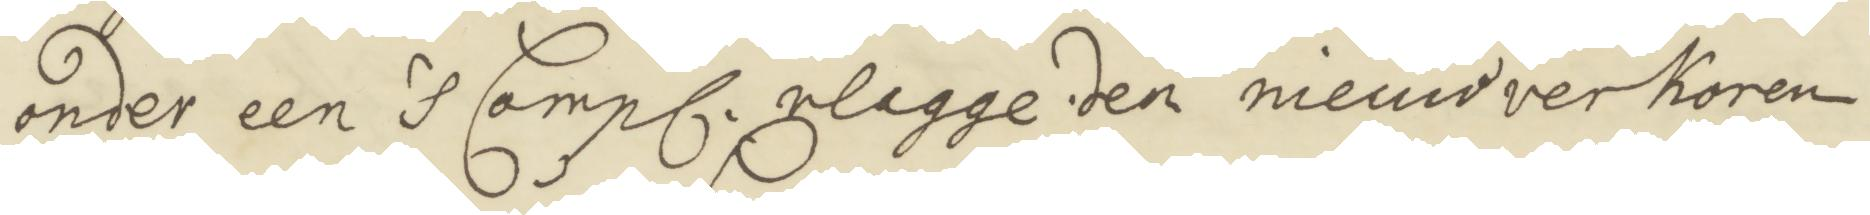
onder een ’s Compl. vlagge den nieuw verkoren
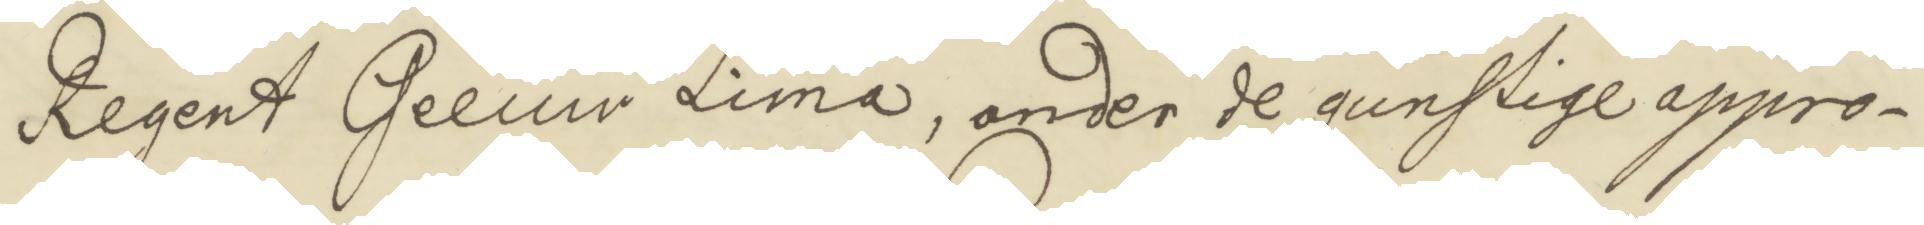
Regent Geluw Lima, onder de gunstige appro-
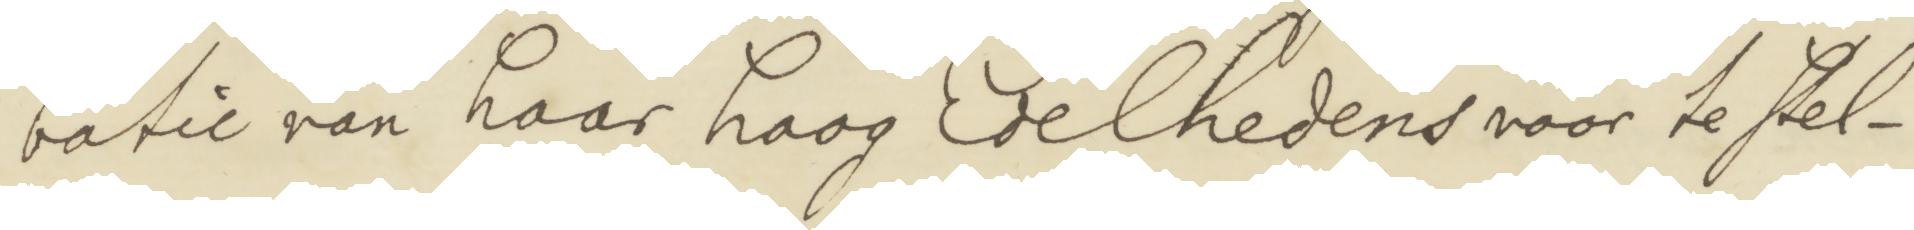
batie van haar hoog Edelhedens voor te stel-
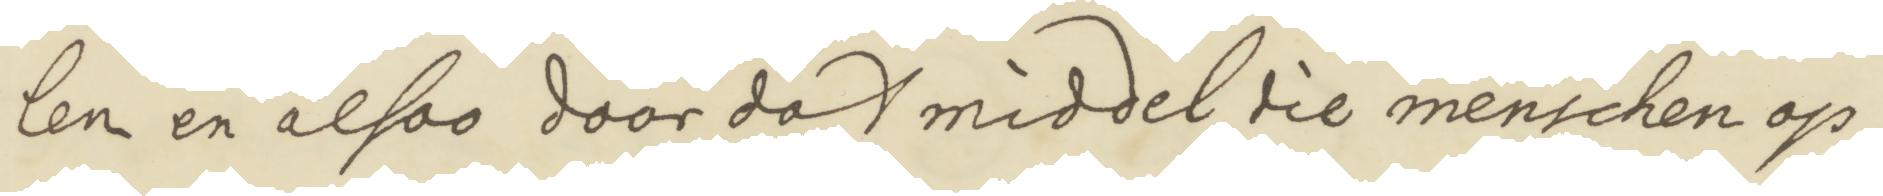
len en alsoo door dat middel die menschen op
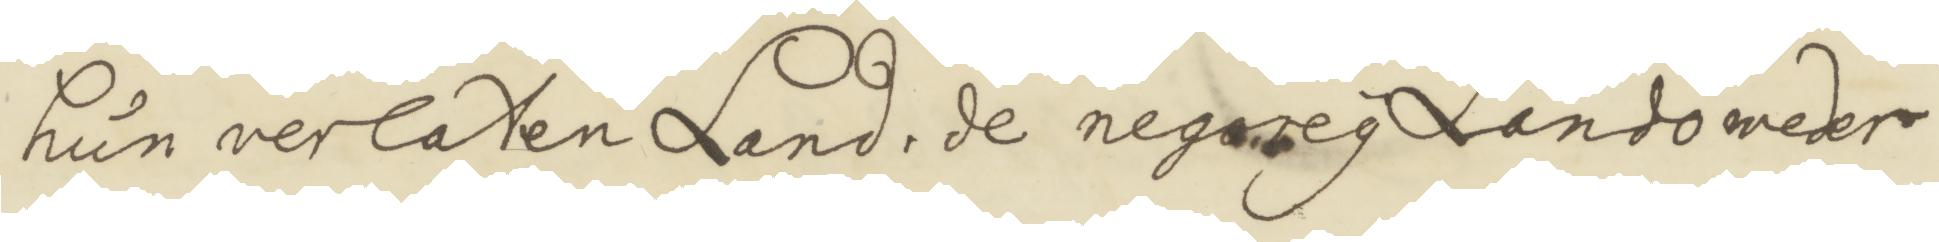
hun verlaten Land, de negorey Lando weder
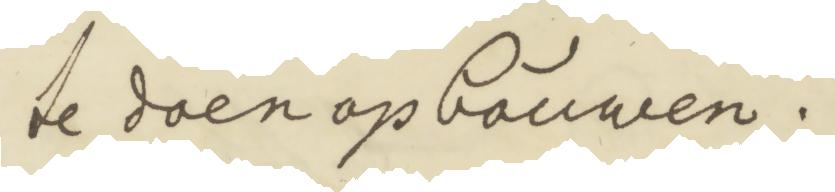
te doen op bouwen.
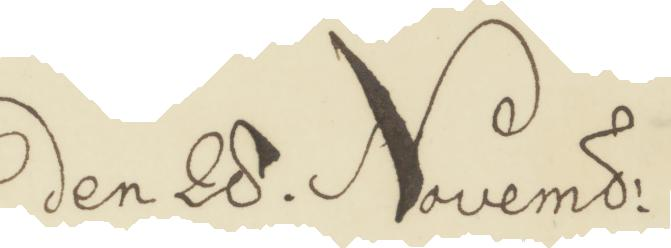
den 28. Novemb:
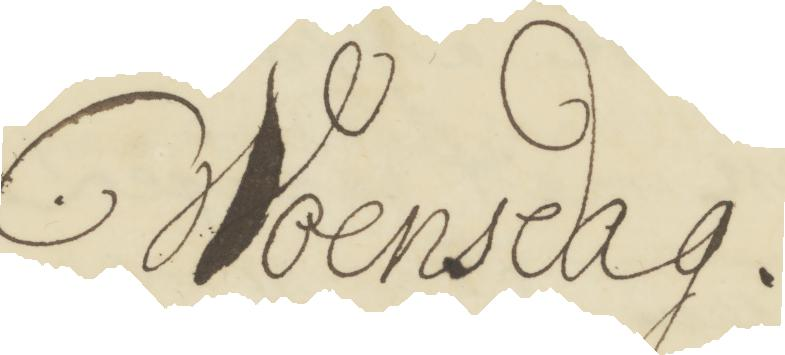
Woensdag.
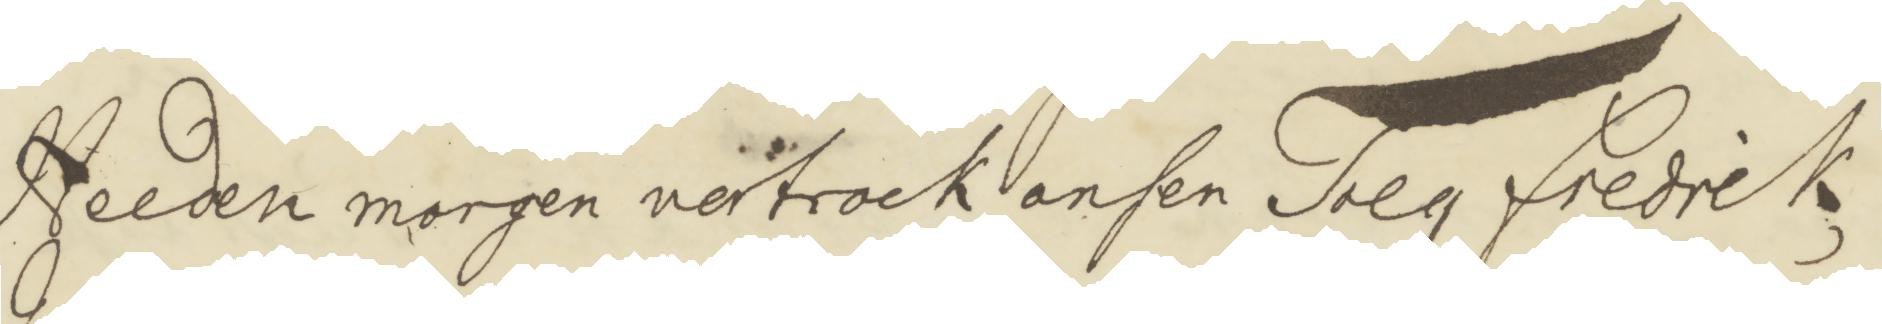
Heeden morgen vertrock onsen Tolq fredrik
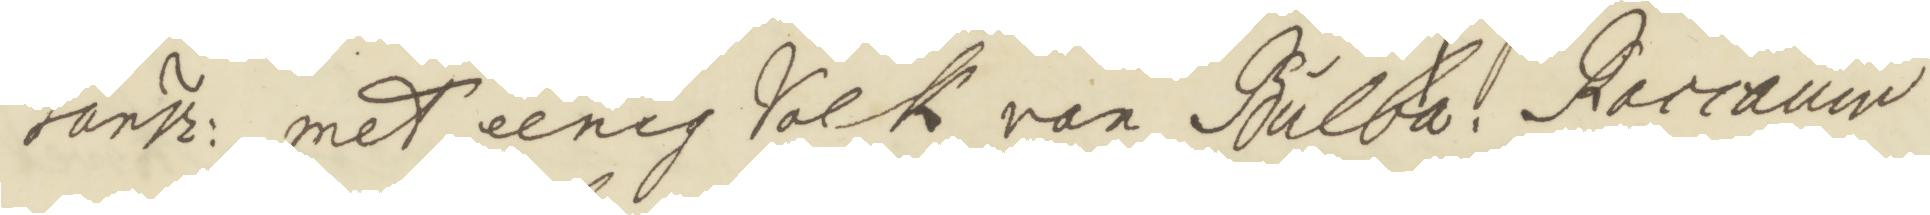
Jansz: met eenig Volk van Bulba, Roccauw
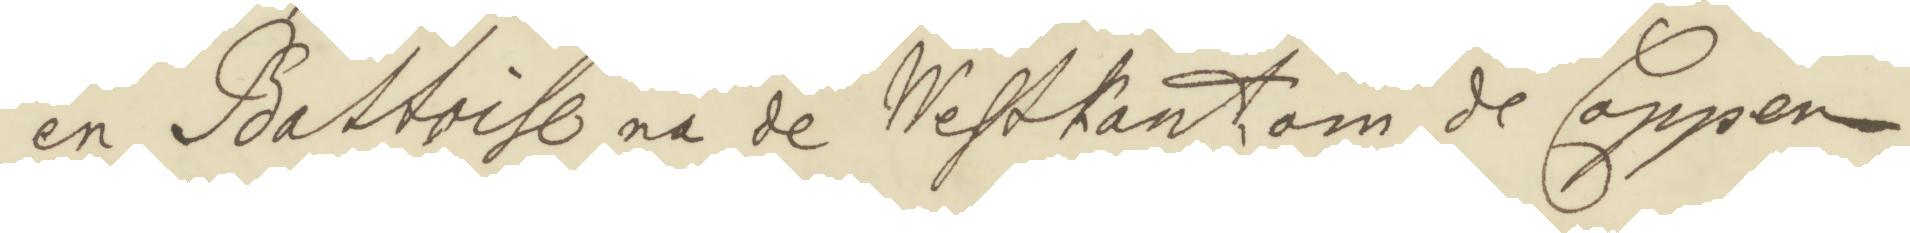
en Battoise na de Westkant om de Coppen
